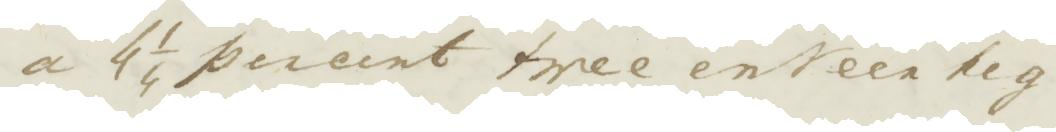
a 4¼ percent twee en Veertig
